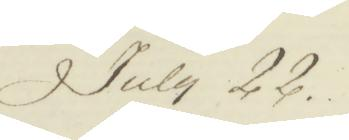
July 22.
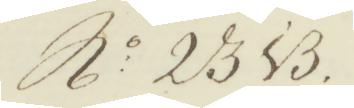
N:o 2323.
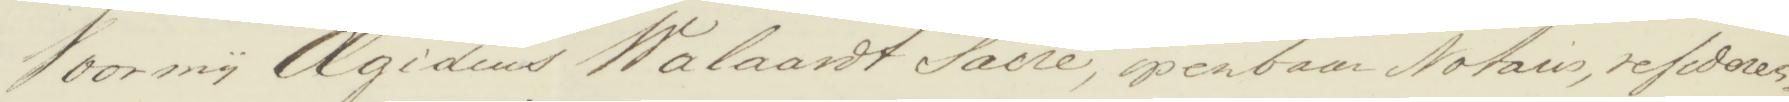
Voor mij AEgidius Walaardt Sacré, openbaar Notaris, resideren„
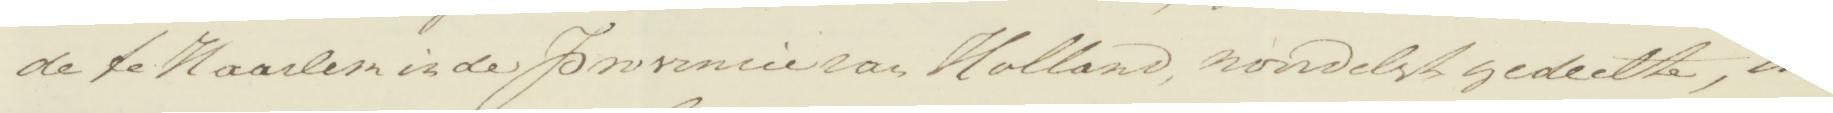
de te Haarlem in de Provincie van Holland, noordelyk gedeelte, in
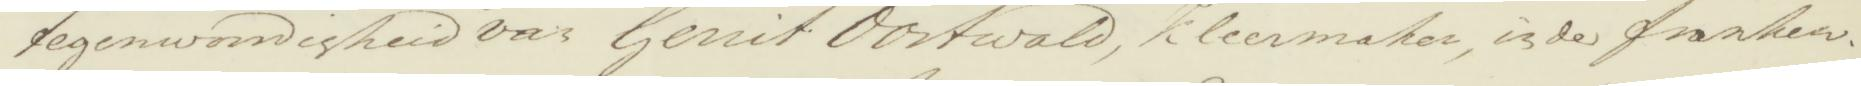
tegenwoordigheid van Gerrit Oostwald, kleermaker, in de franken„
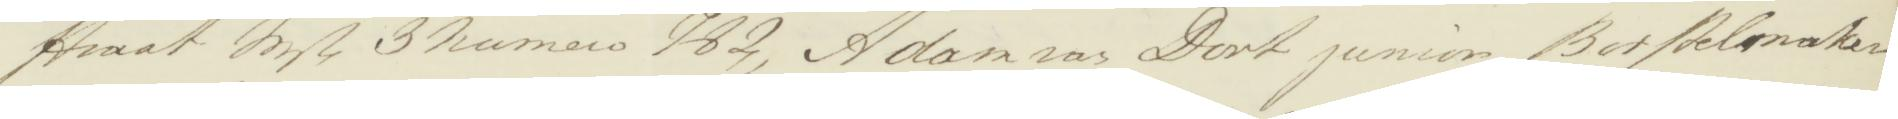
straat Wyk 3 numero 782, Adam van Dort junior Borstelmaker
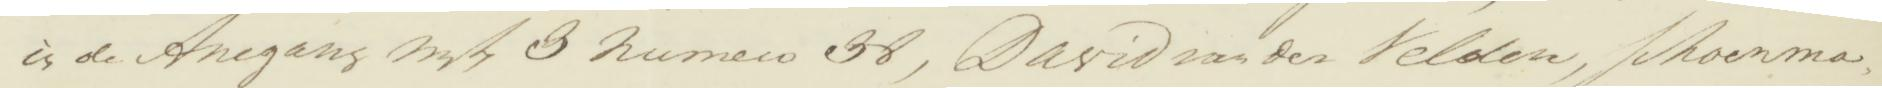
in de Anegang Wyk 3 numero 38, David van der Velden, schoenma„
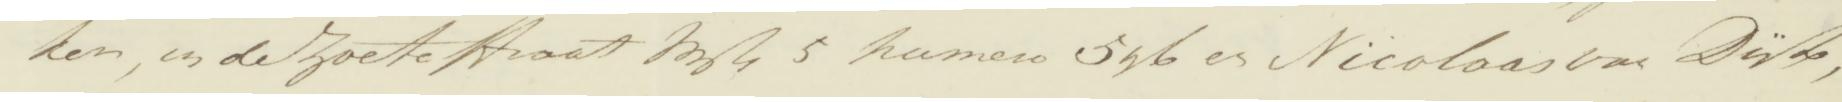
ken, in de zoete straat Wyk 5 numero 596 en Nicolaas van Dijk,
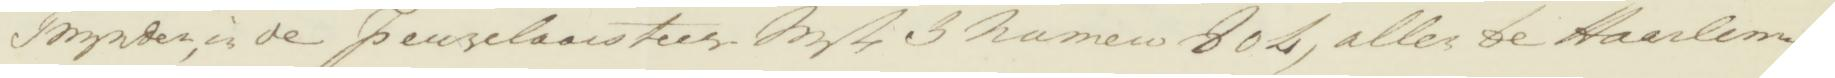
Twynder, in de Peuzelaarsteeg Wyk 3 numero 804, allen te Haarlem
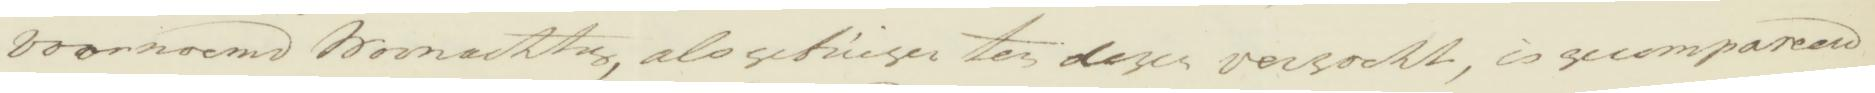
voornoemd woonachtig, als getuigen ten dezen verzocht, is gecompareerd
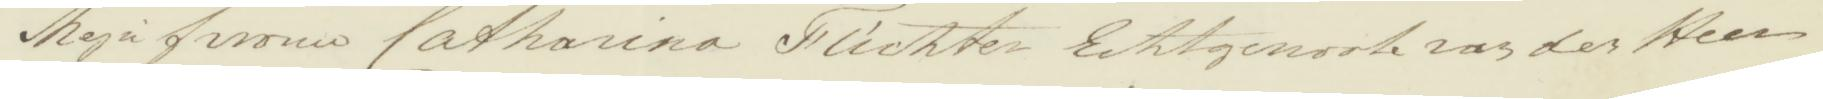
Mejufvrouw Catharina Fuchter Echtgenoote van den Heer
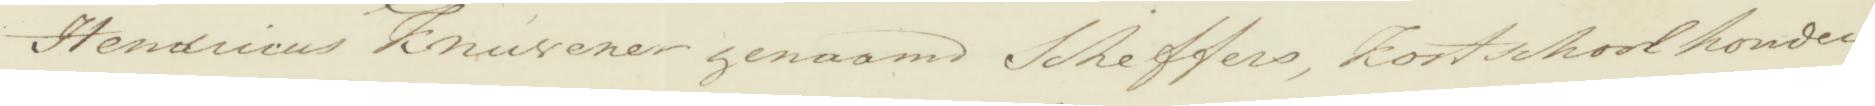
Hendricus Knuvener genaamd scheffers, kostschool houder
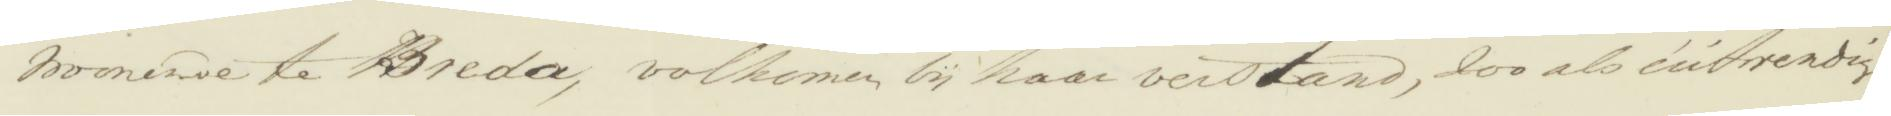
woonende te Breda, volkomen bij haar verstand, zoo als uitwendig
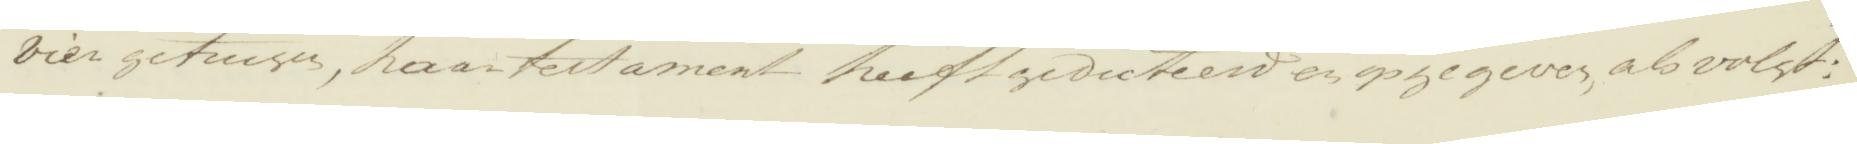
vier getuigen, haar testament heeft gedicteerd en opgegeven, als volgt:
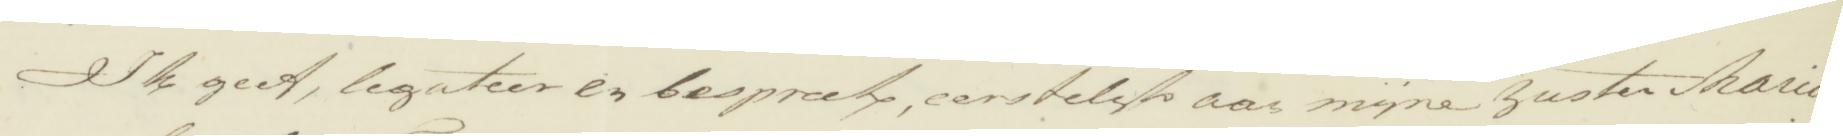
Ik geef, legateer en bespreek, eerstelyk aan mijne zuster Maria
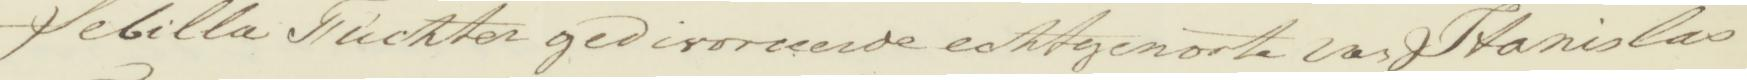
Sibilla Fuchter gedivorceerde echtgenoote van Stanislas
